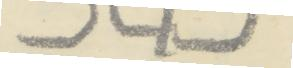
545
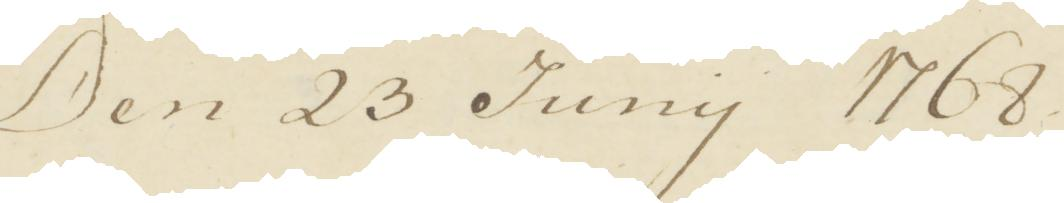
Den 23 Junij 1768.
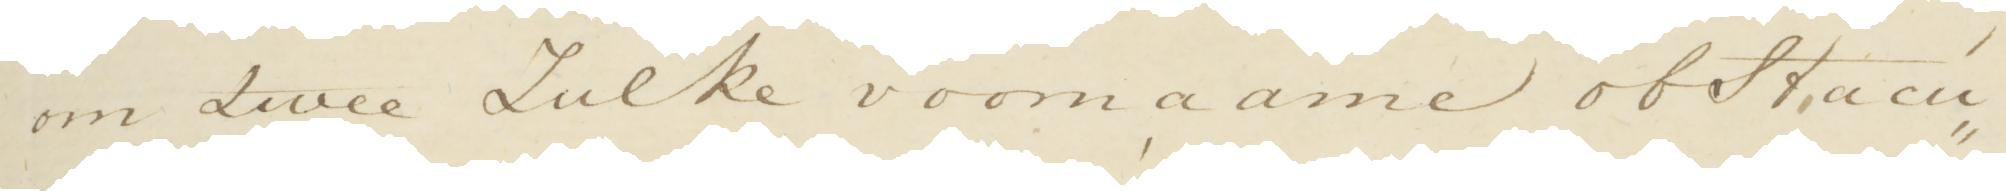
om twee zulke voornaame obstacu„
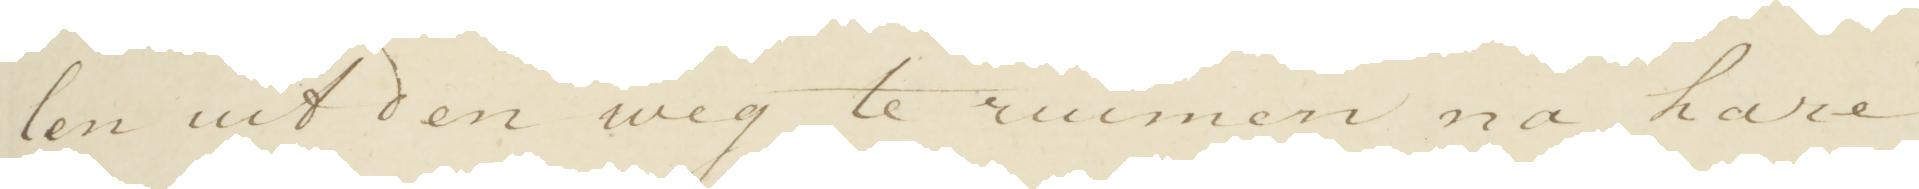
len uit den weg te ruimen na hare
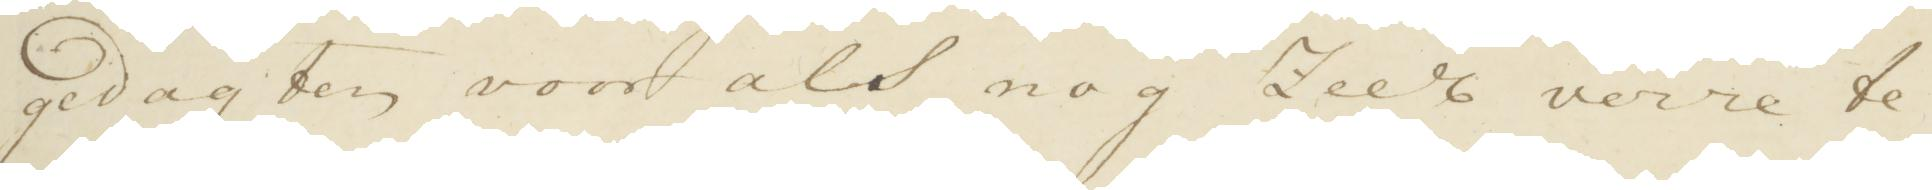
gedagten voor als nog zeer verre te
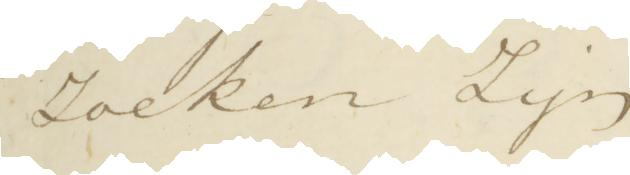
zoeken zijn.
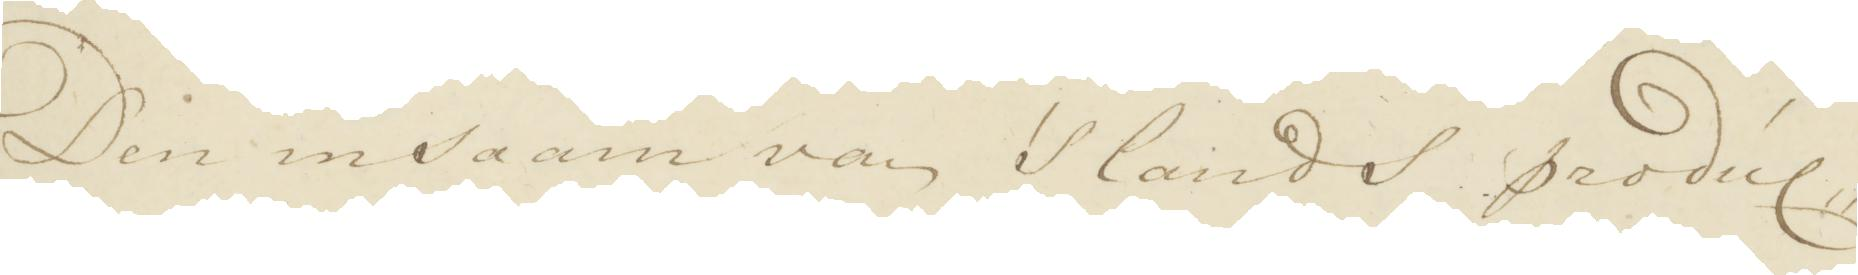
Den insaam van 's lands produc„
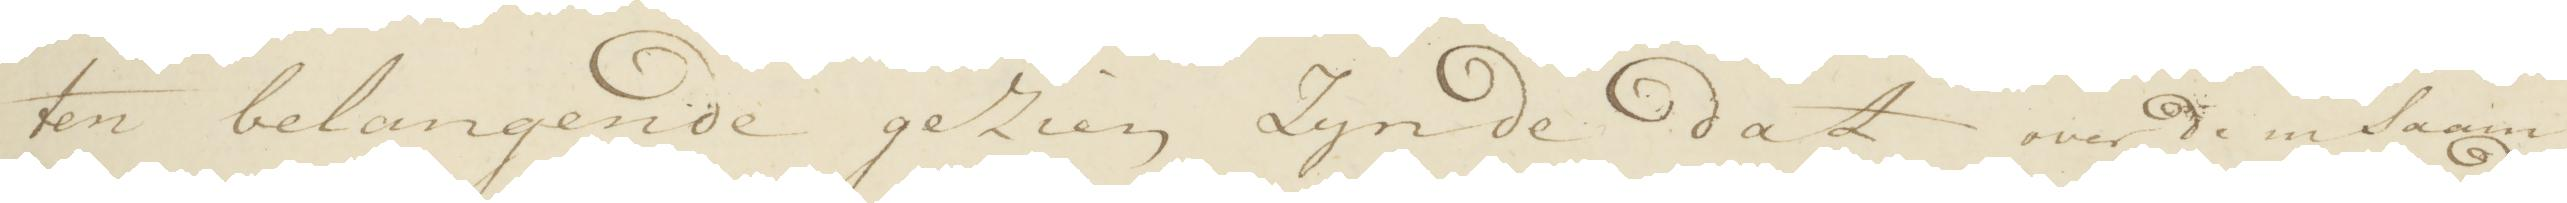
ten belangende gezien zynde dat over de in saam
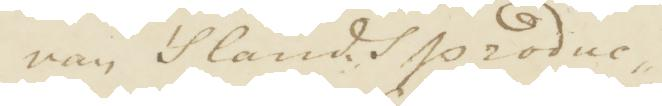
van 's lands produc„
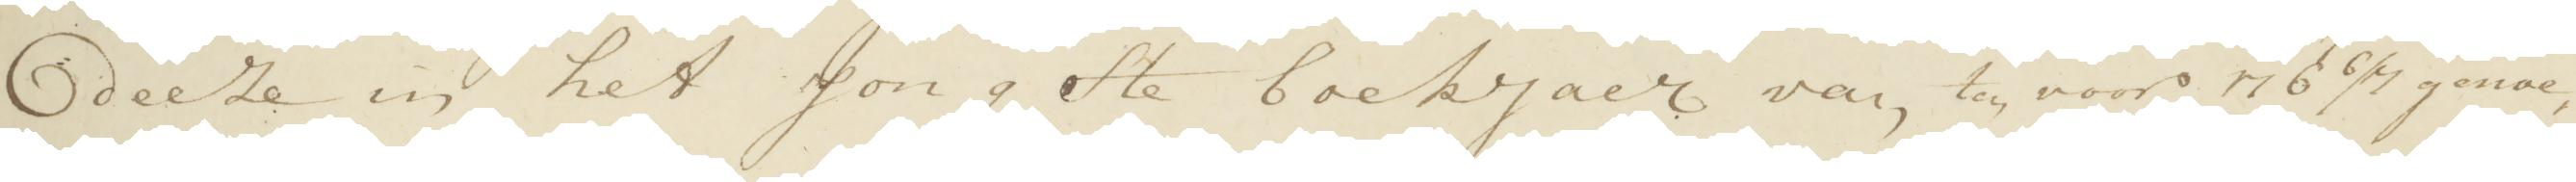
deeze in het jongste boekjaer van ten voor 176 6/7 genoe„
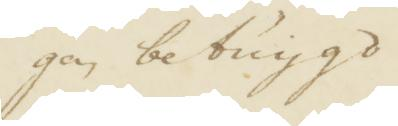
gen betuijgd
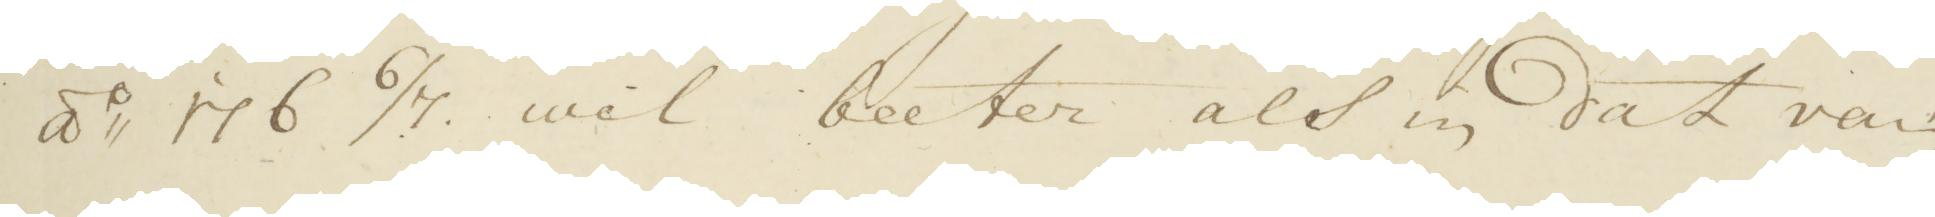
a„o 176 6/7. wel beeter als in dat van
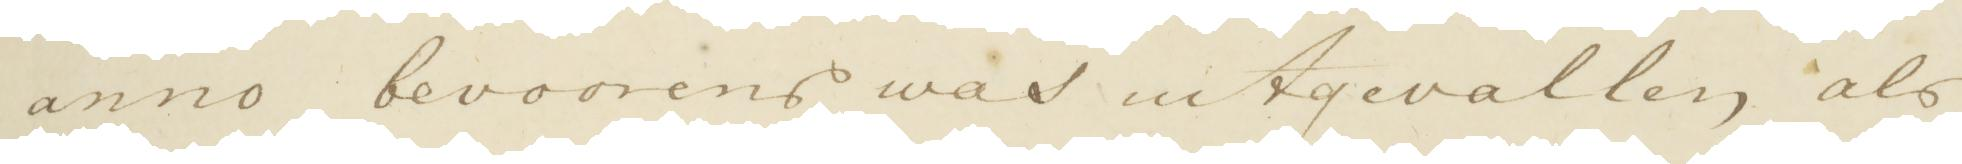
anno bevoorens was uitgevallen als
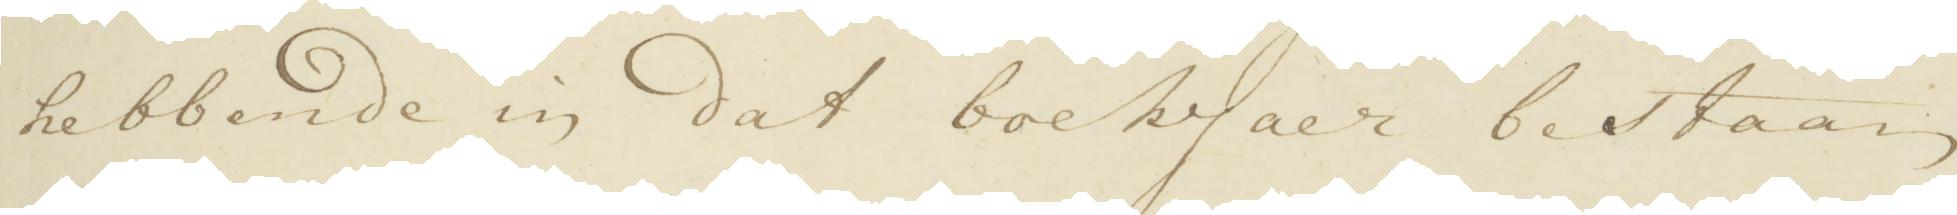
hebbende in dat boekjaer bestaan
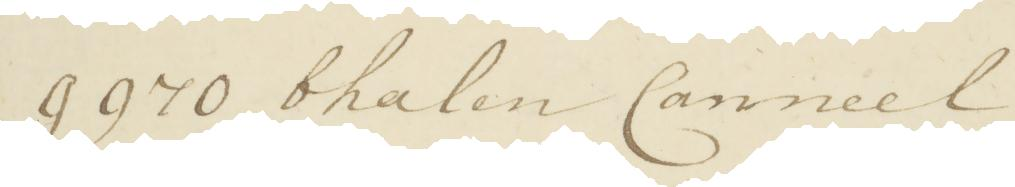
9970 bhalen Canneel
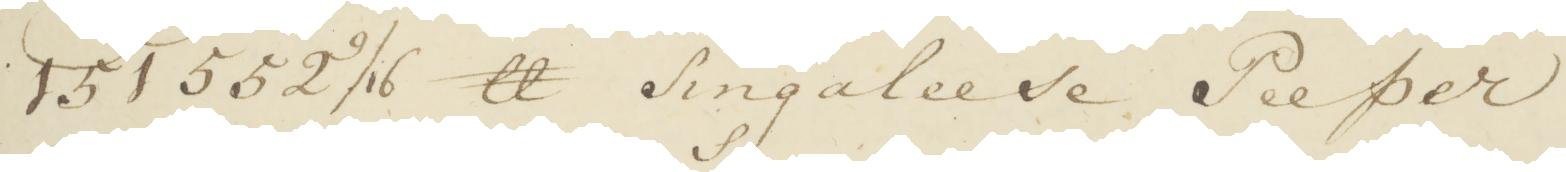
151552 9/16 lb Singaleese Peeper
